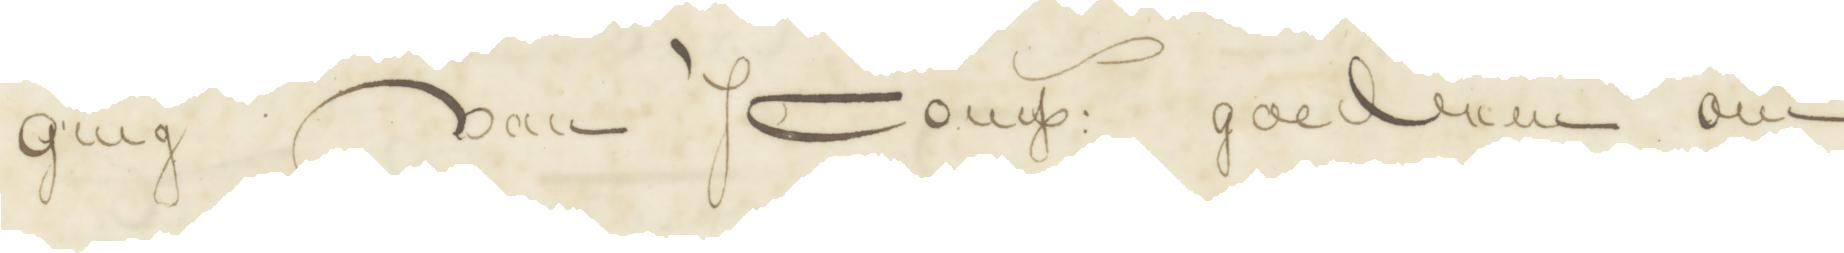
ging van 'sComp: goederen om
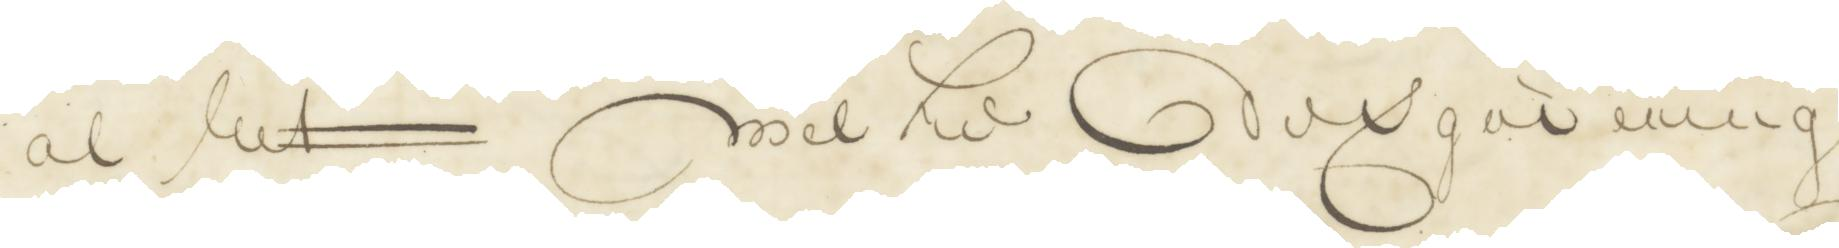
al het welke de vergadering
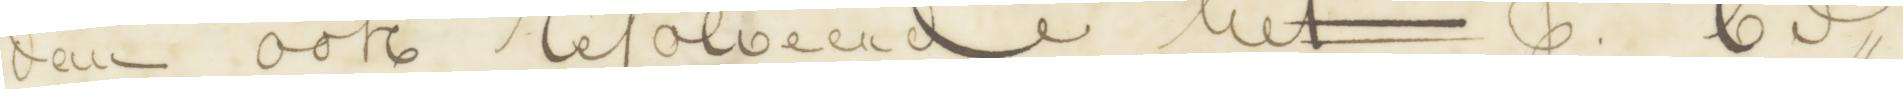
dan ook resolveerde het p.l be„
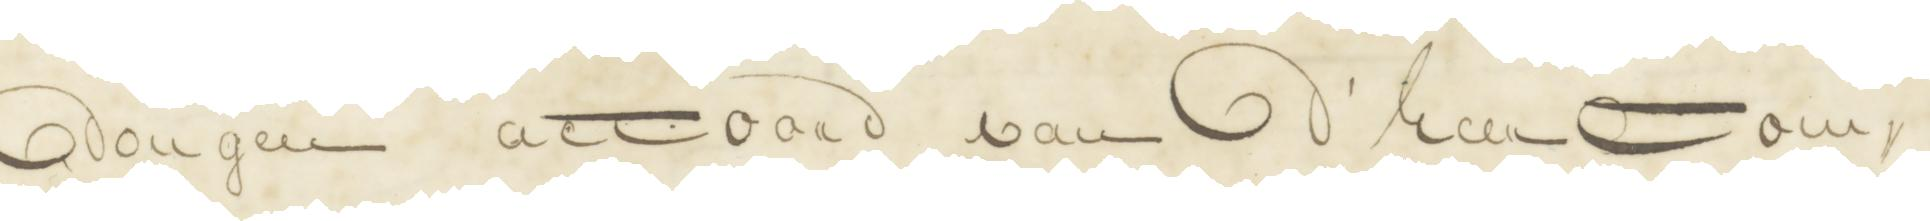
dongen accoord van d’ heer com„
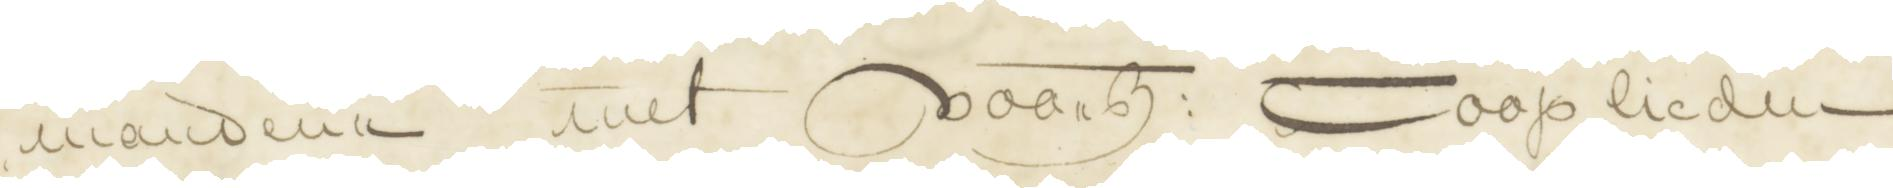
mandeur met voorsz: cooplieden
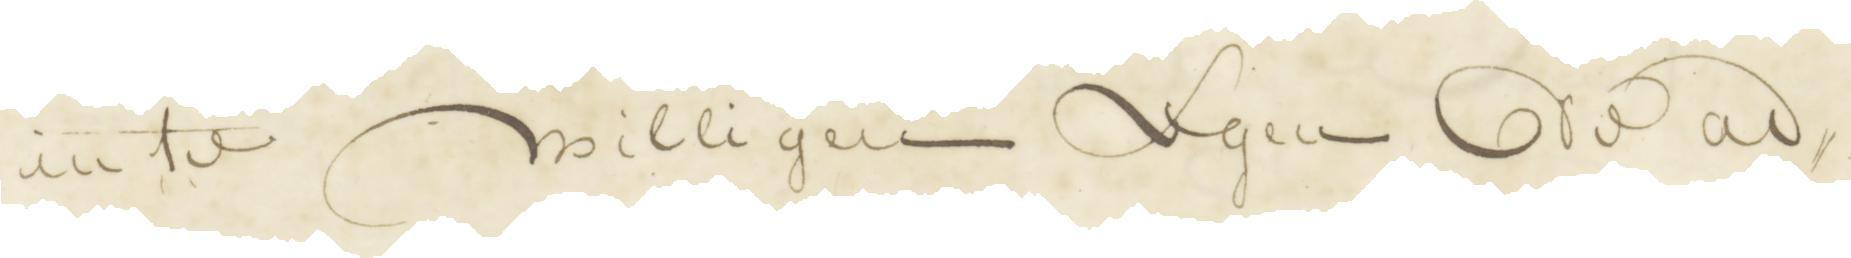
in te willigen tegen de ad„
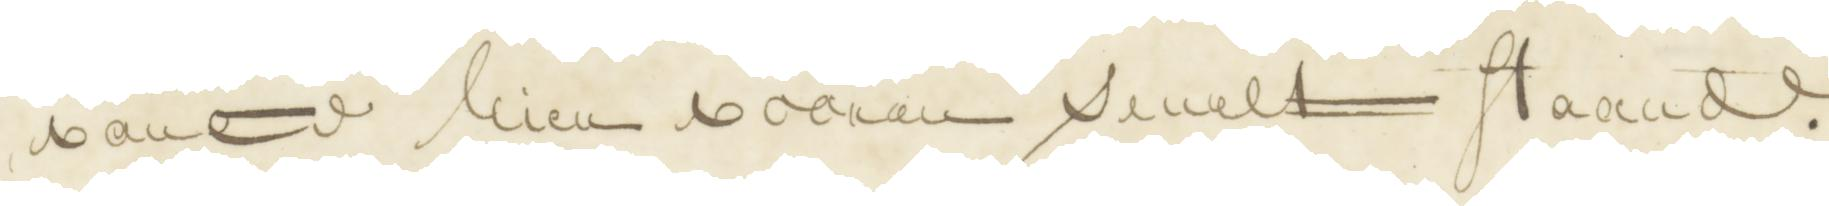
vance hier vooren vermelt staande.
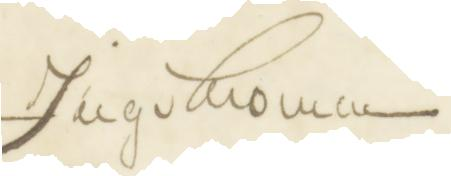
Jngekomen
